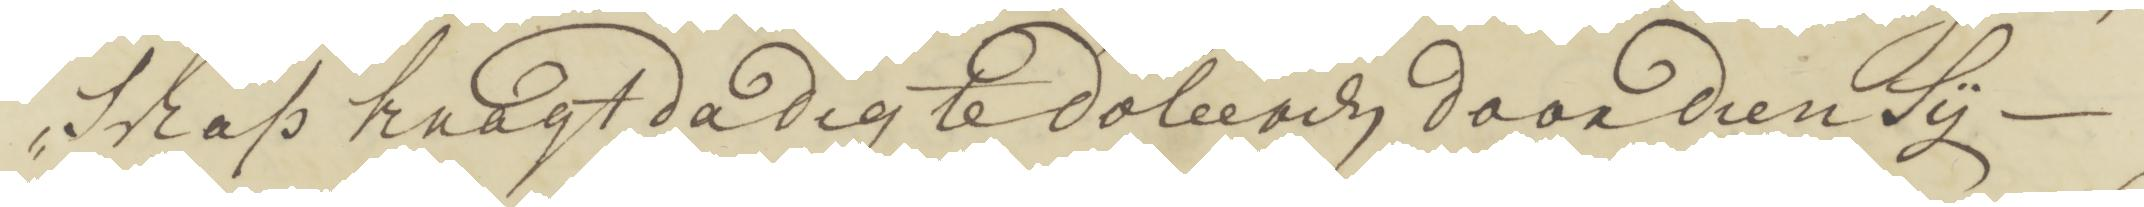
„schap kragtdadig te doleeren door dien sij —
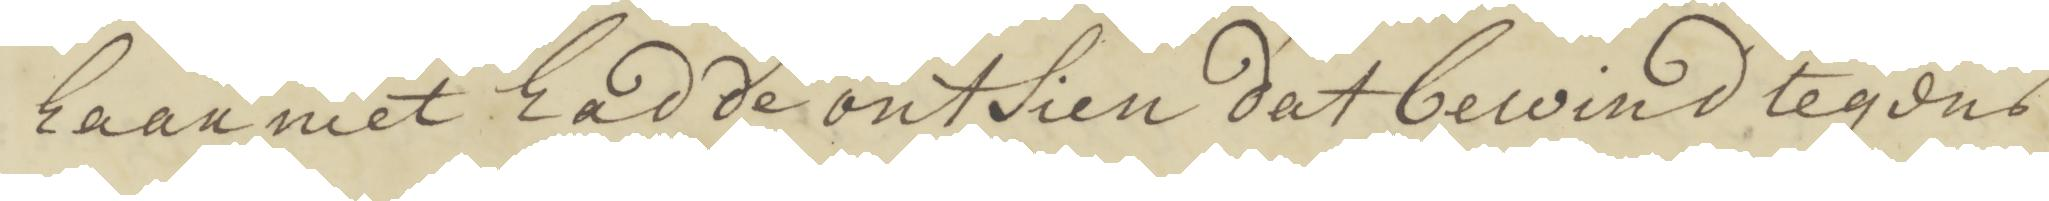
haar niet hadde ontsien dat bewind tegens
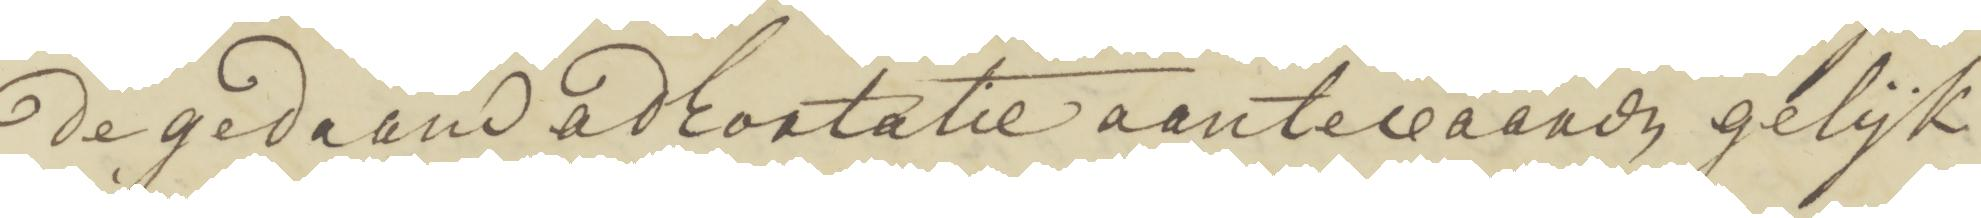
de gedaane adhortatie aantevaaren gelijk
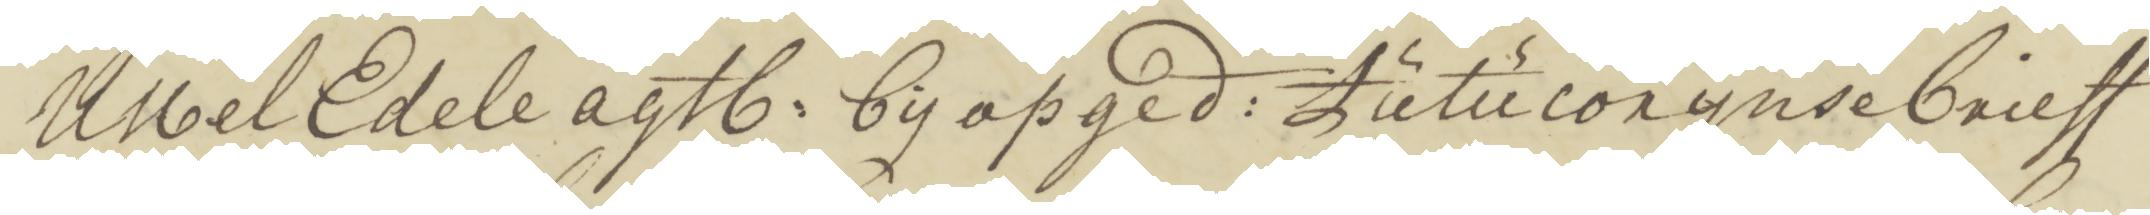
uwel Edele agtb: bij opged: Tutucorynse brieff
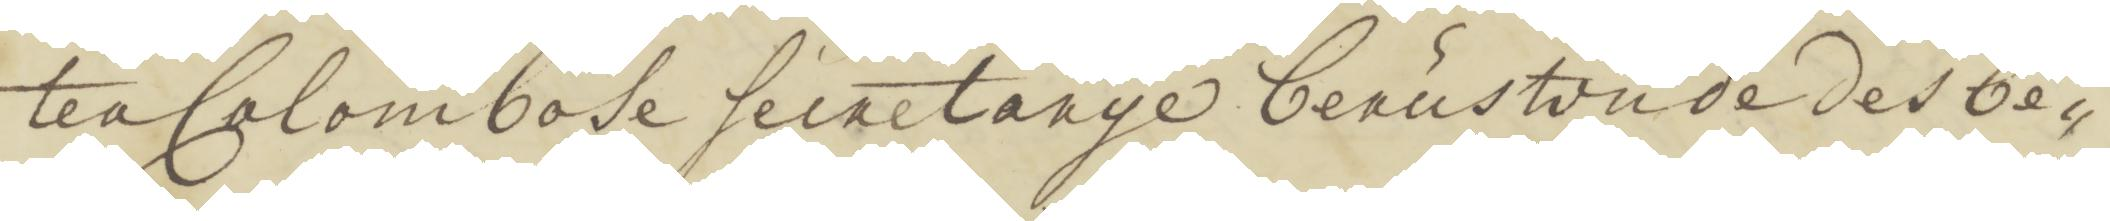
ter Colombose secretarije berustende des be„
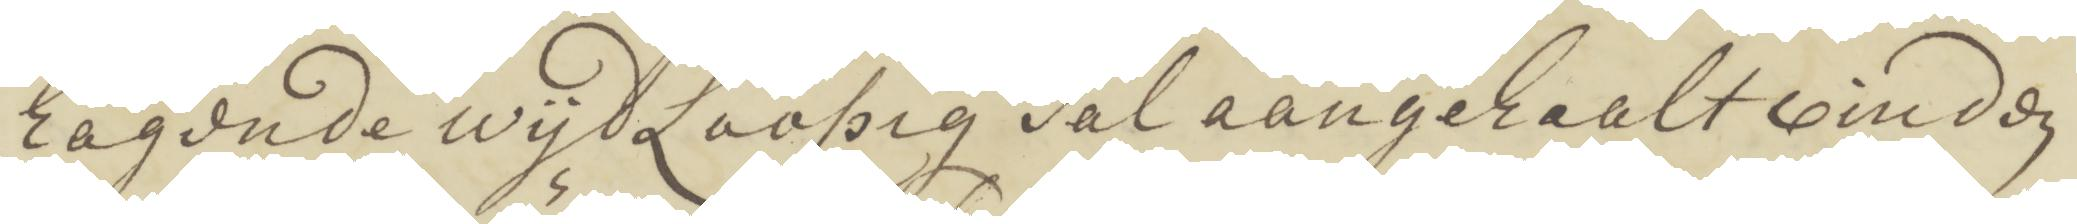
hagende wijd Loopig sal aangehaalt vinden
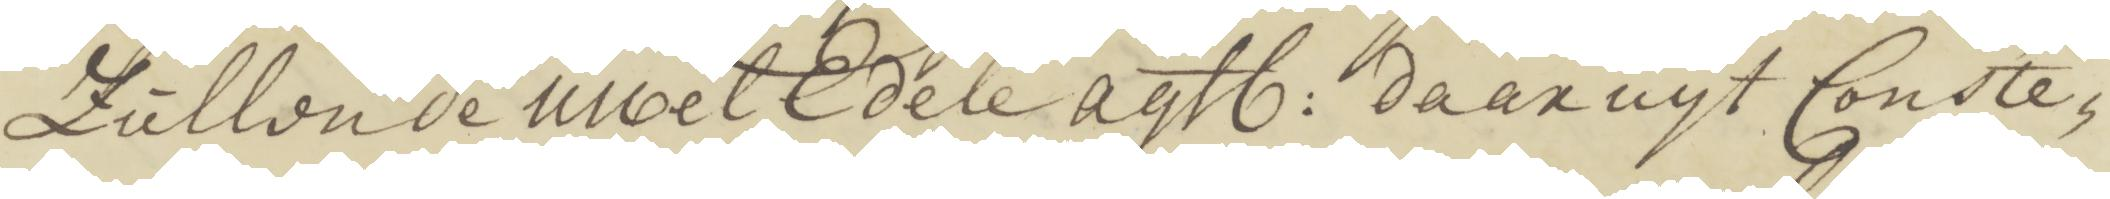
zullen de uwel Edele agtb: daar uijt Conste„
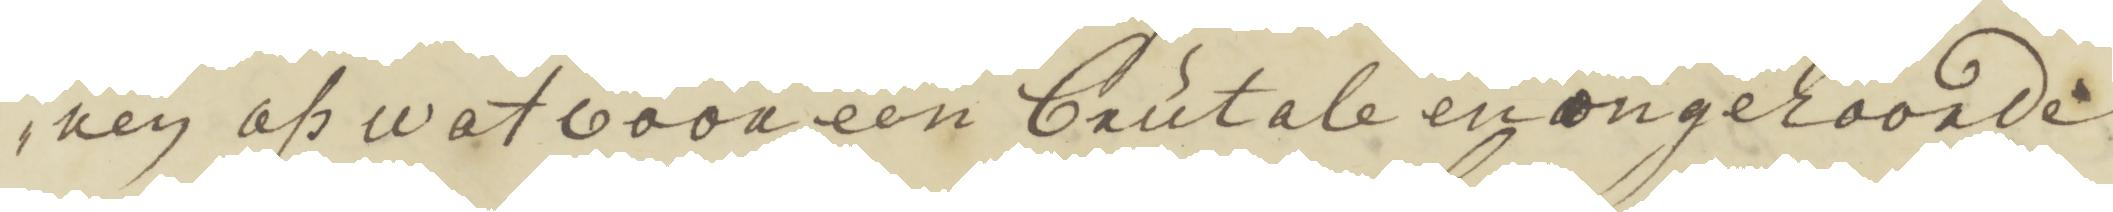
„ren op wat voor een brutale en ongehoorde
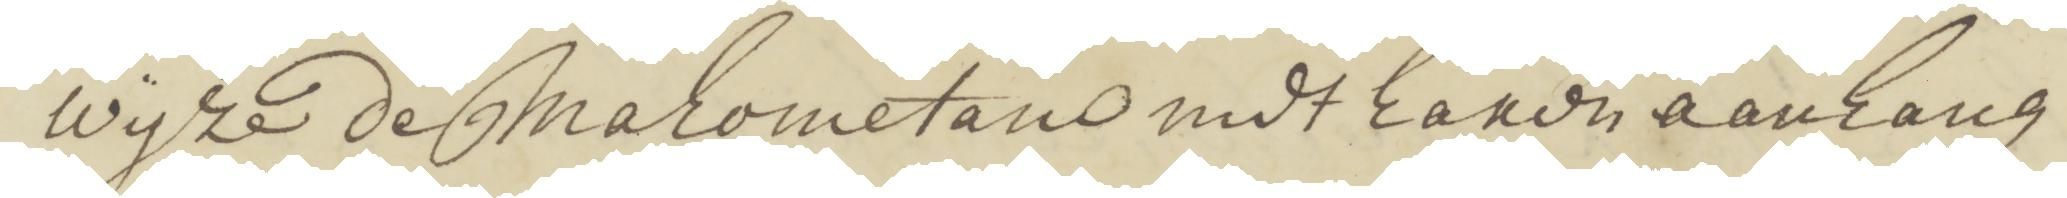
wijze de Mmahometane met haren aanhang
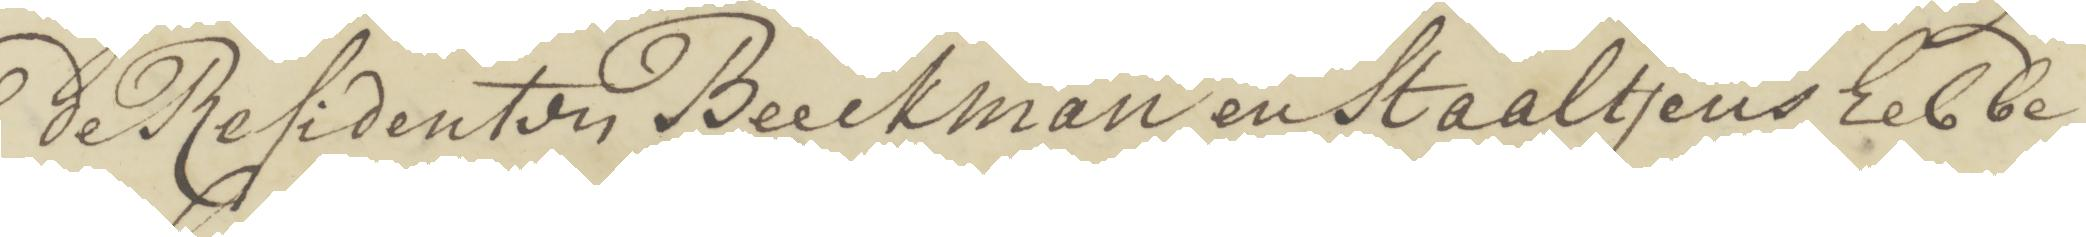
de Residenten Beeckman en Staaltjens hebbe
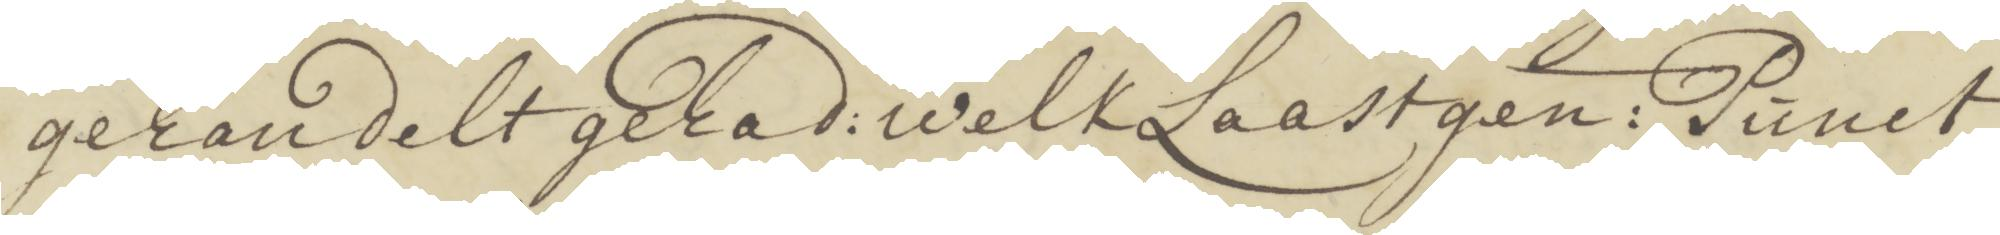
gehandelt gehad: welk Laastgen: Punct
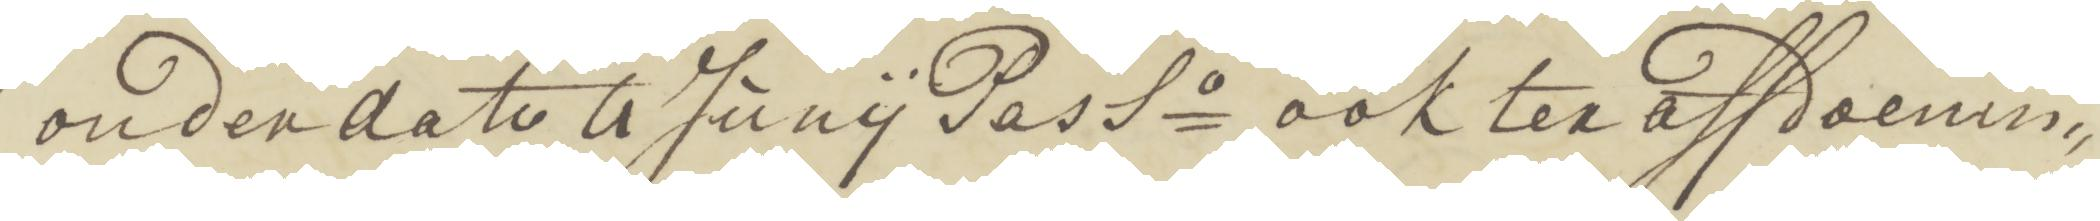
onder dato 4 Junij Pass=o ook ter affdoenin„
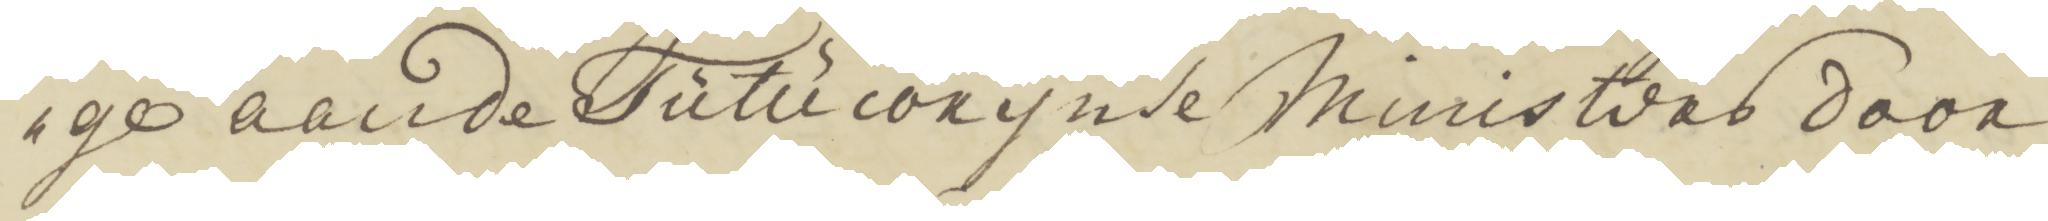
„ge aan de Tutucorijnse Ministers door
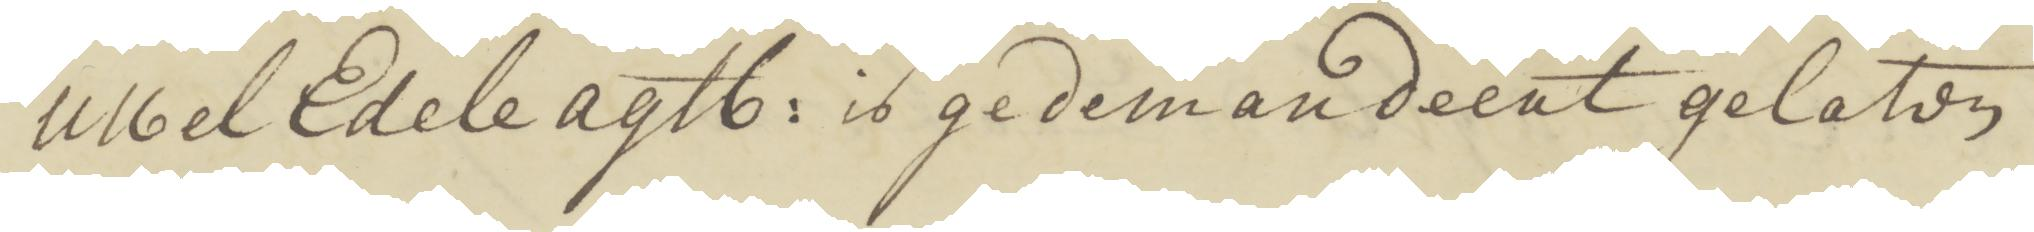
uwel Edele agtb: is gedemandeert gelaten
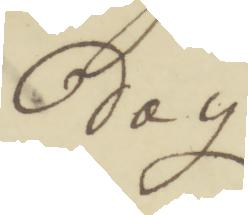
dag
